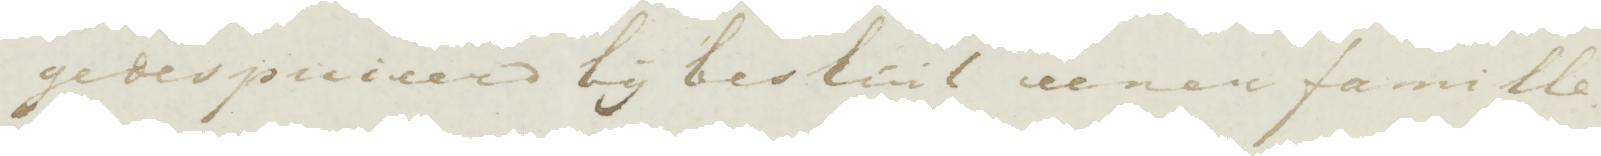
gedespicieerd bij besluit eenen famille
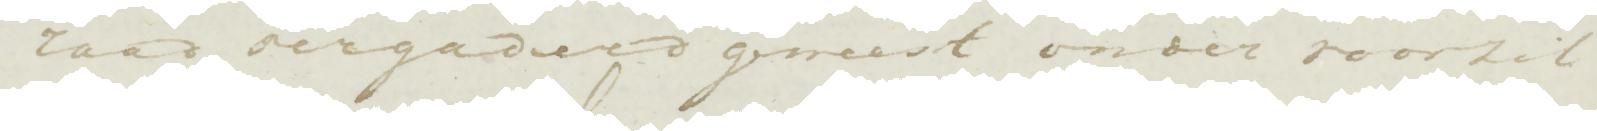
raad, vergaderd geweest onder voorzit
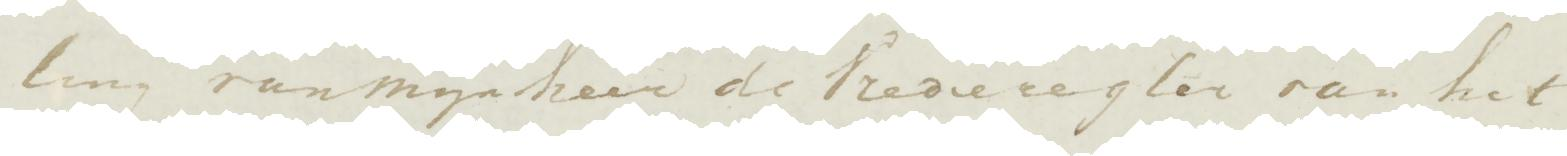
ting van mijn heer de Vrederegter van het
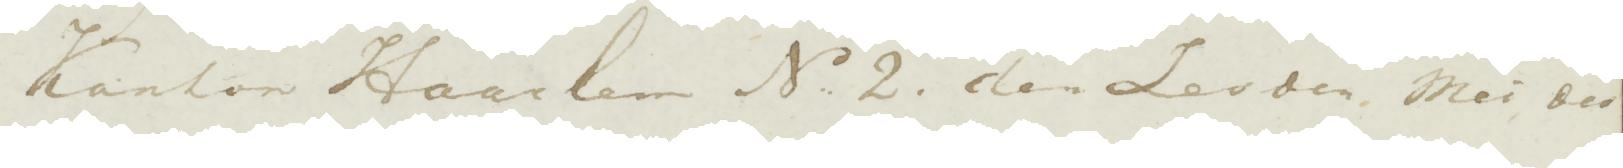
Kanton Haarlem N. 2. den Zesden meij des
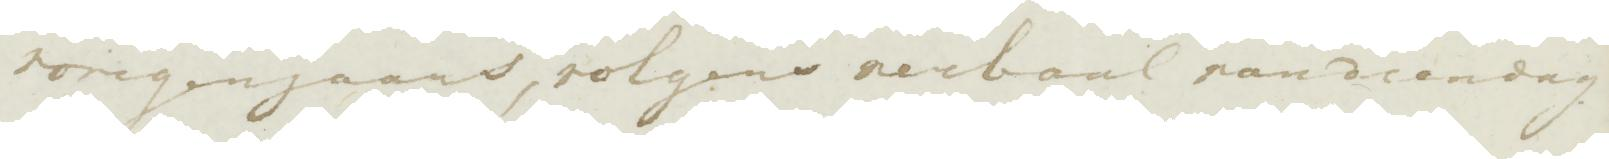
vorigen jaars, volgens verbaal van dien dag
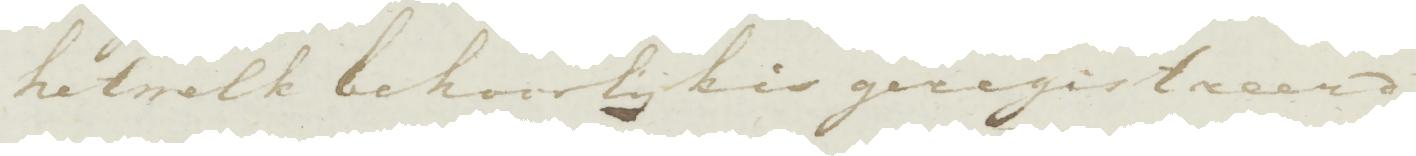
hetwelk behoorlijk is geregistreerd.
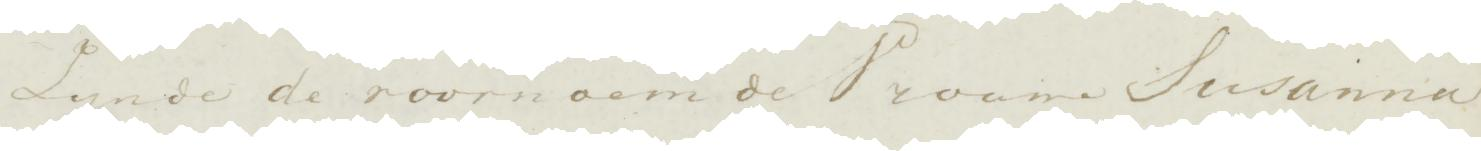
Zynde de voornoemde Vrouwe Susanna
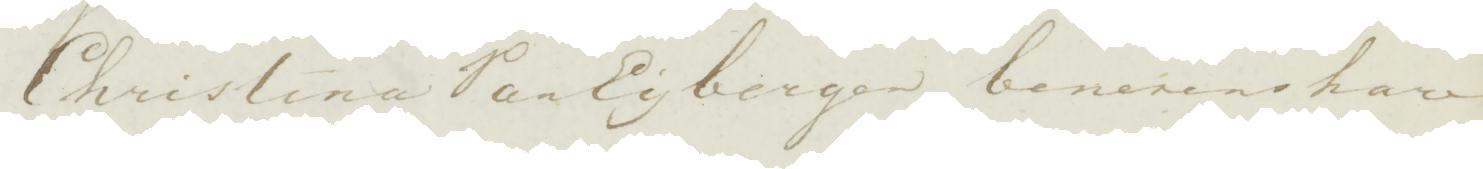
Christina Van Eijbergen benevens hare
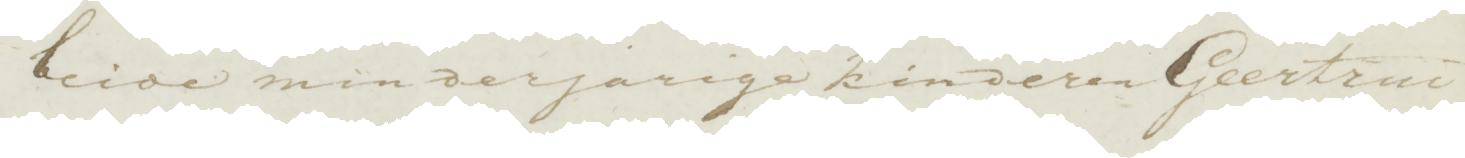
beide minderjarige kinderen Geertrui
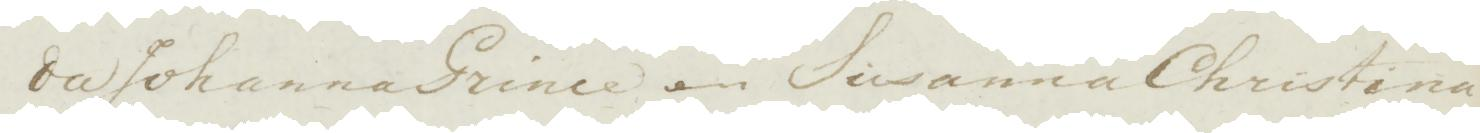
da Johanna Prince en Susanna Christina
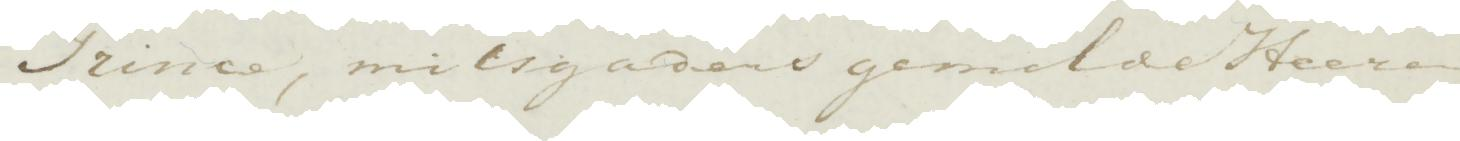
Prince, mitsgaders gemelde Heeren
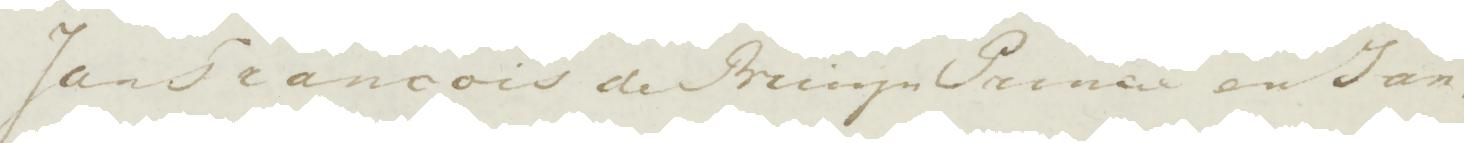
Jan Francois de Bruyn Prince en Jan
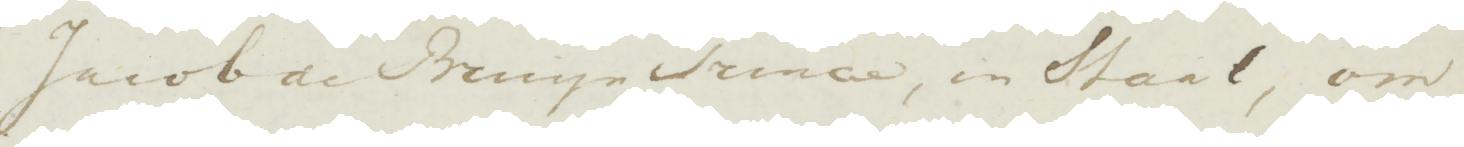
Jacob de Bruyn Prince, in staat, om
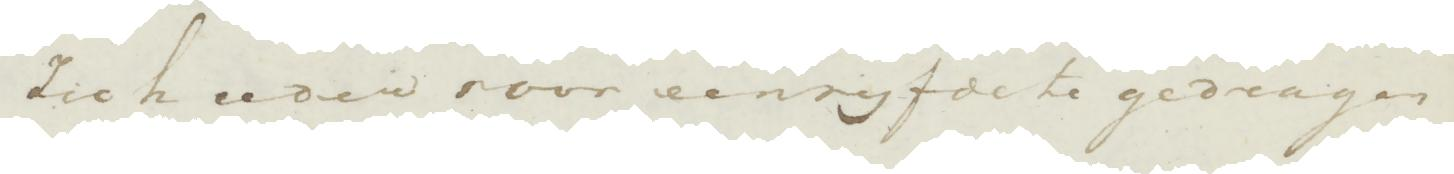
zich ieder voor een vijfde te gedragen
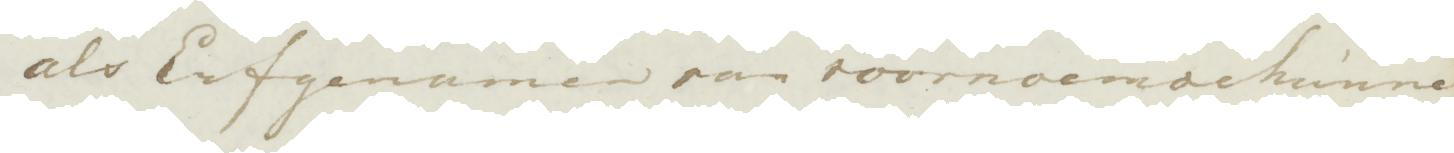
als Erfgenamen van voornoemde hunne
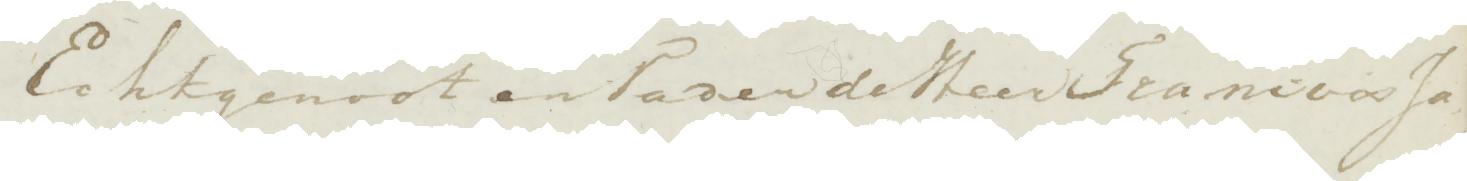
Echtgenoot en Vader de Heer Francois Ja
